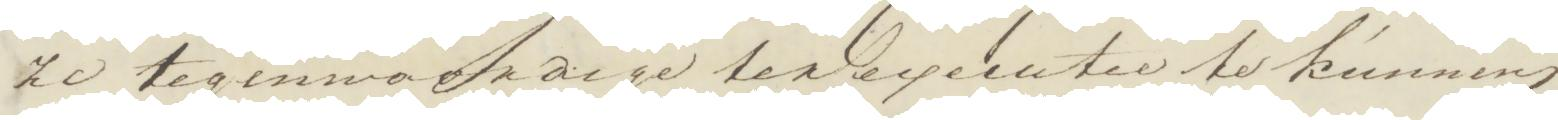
ze tegenwoordige ter executie te kunnen
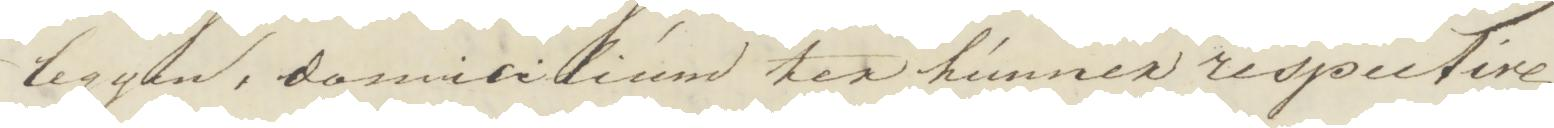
leggen, domicilium ter hunner respective
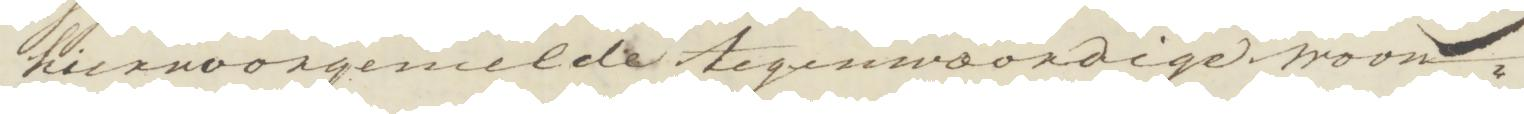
hiervoor gemelde tegenwoordige woon„
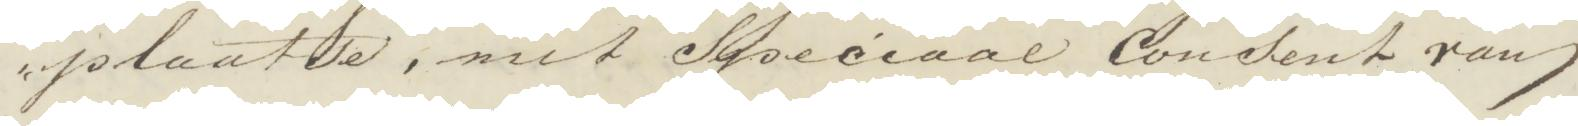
„plaatse, met speciaal Consent van
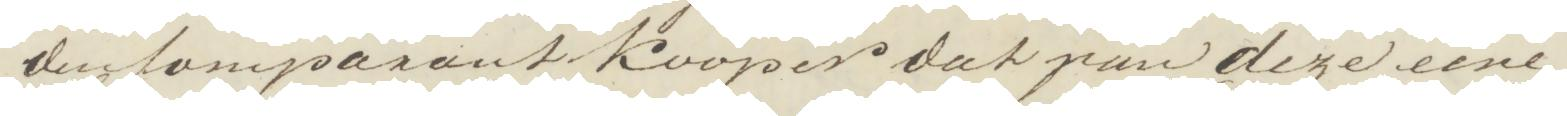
den Comparant kooper dat van deze eene
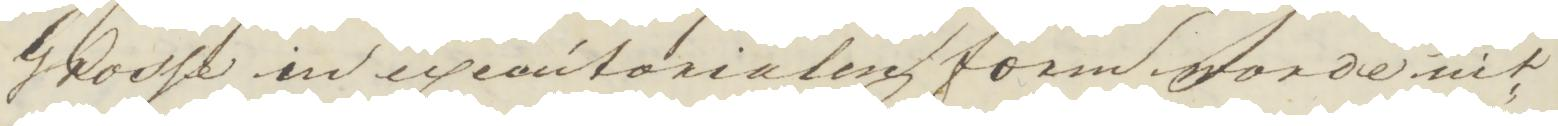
Grosse en executorialen form worde uit„
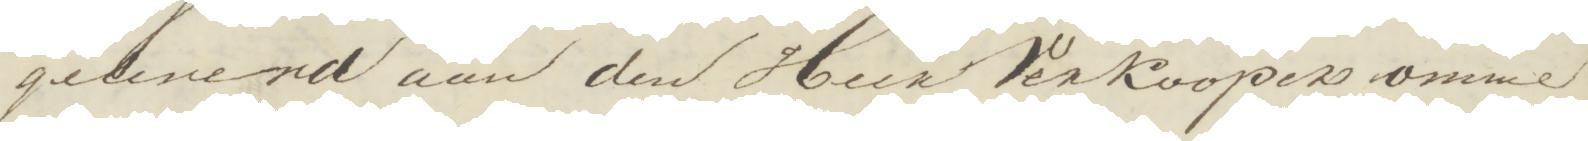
geleverd aan den Heer Verkooper omme
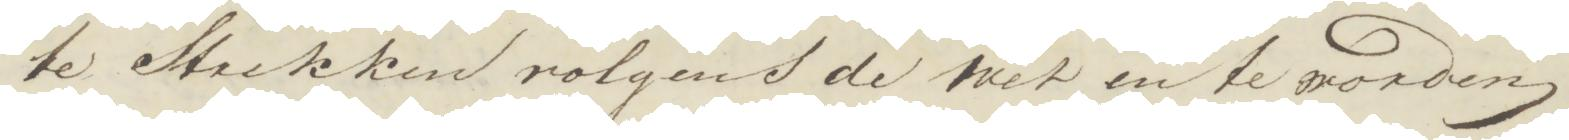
te strekken volgens de wet en te worden
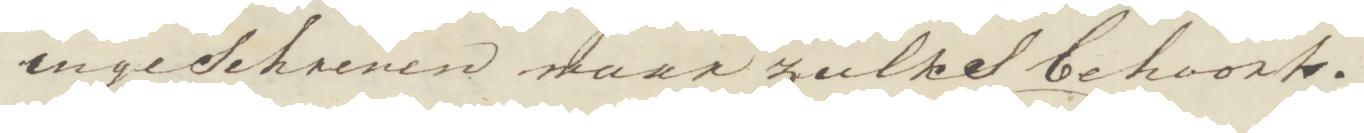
ingeschreven waar zulks behoort.
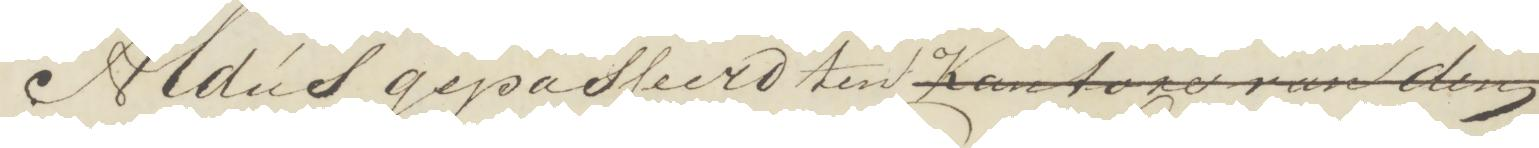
Aldus gepasseerd ten kantore van den
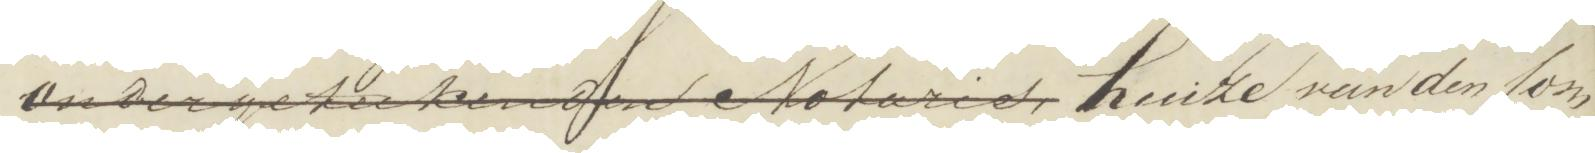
ondergeteekenden Notaris, huize van den Com
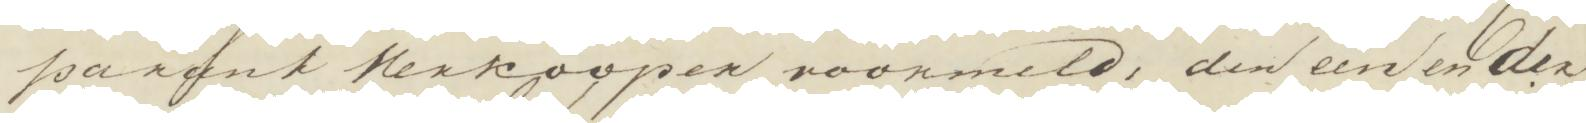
parant verkooper voormeld, den een en der
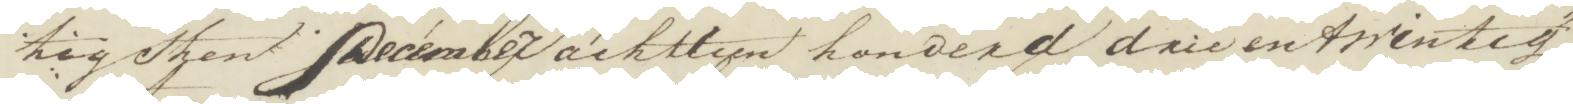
tigsten December achttien honderd drie en twintig
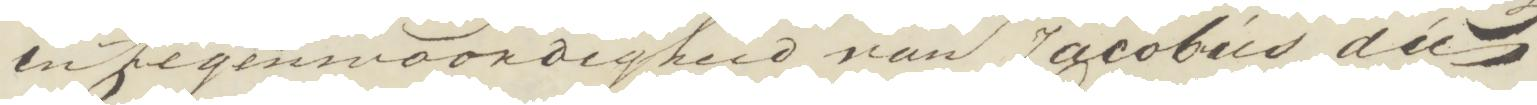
in tegenwoordigheid van Jacobus du
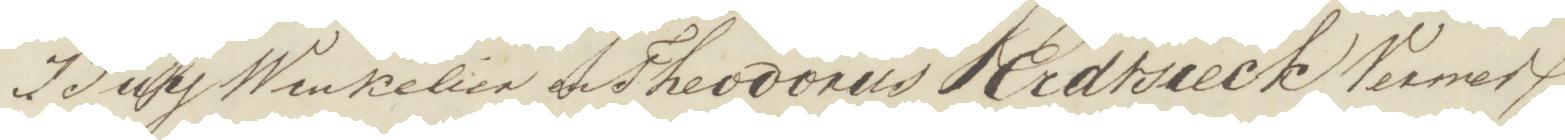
Buy Winkelier en Theodorus Erdtsieck, Verwer,
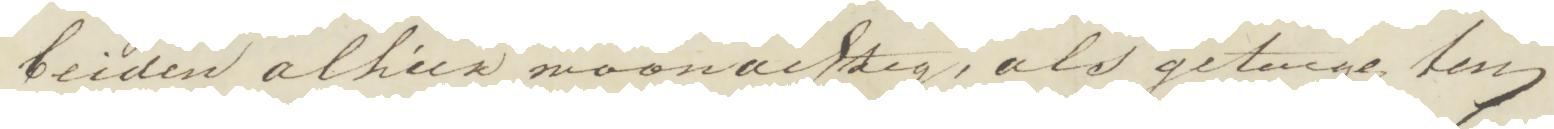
beiden alhier woonachtig, als getuige ten
